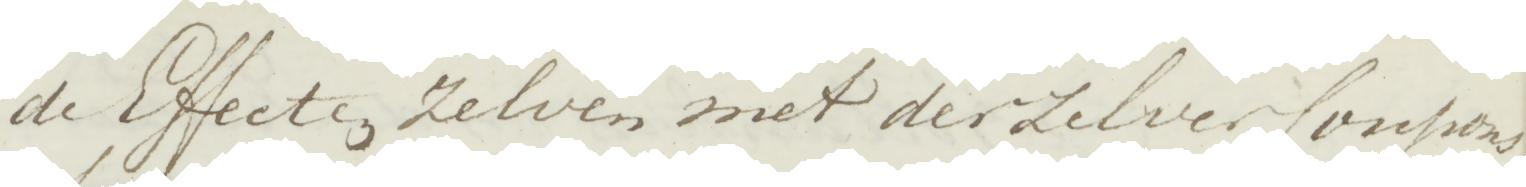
de Effecten zelven met derzelver Coupons
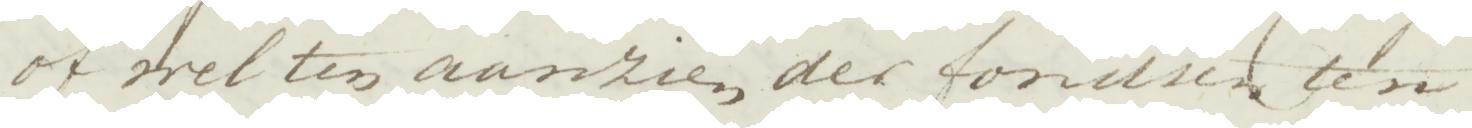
of wel ten aanzien der fondsen ten
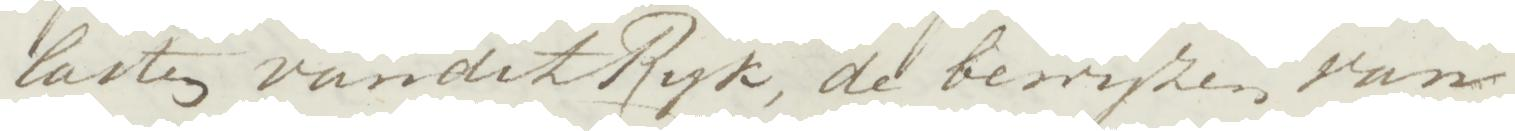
lasten van dit Ryk, de bewyzen van
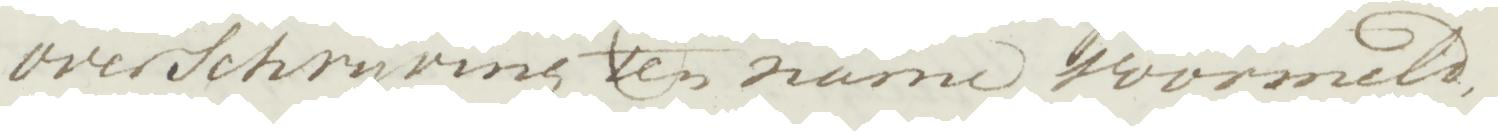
overschryving ten name voormeld,
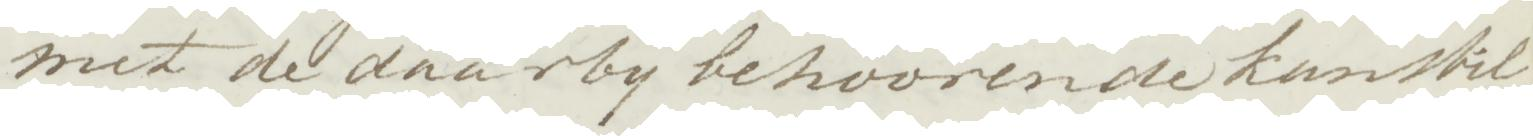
met de daarby behoorende kansbil
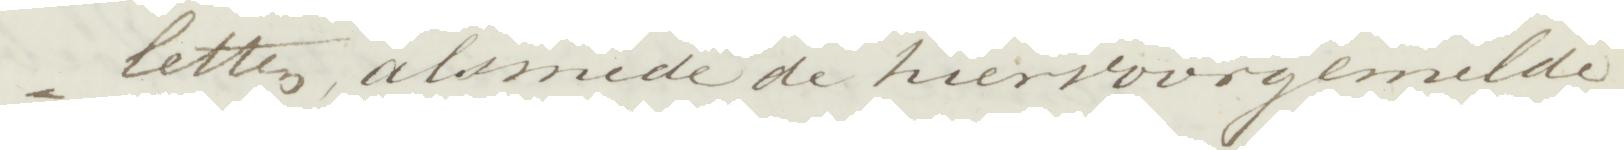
=letten, alsmede de hiervoorgemelde
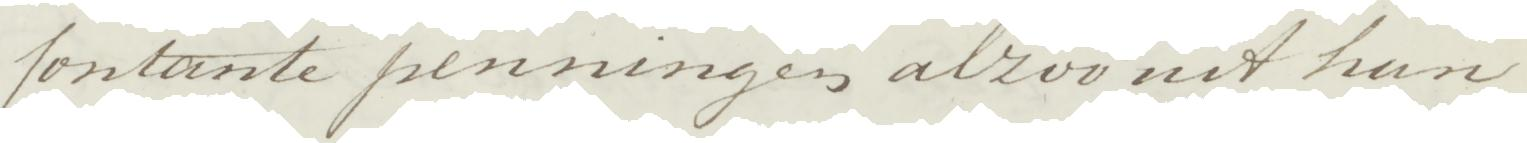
Contante penningen alzoo uit han
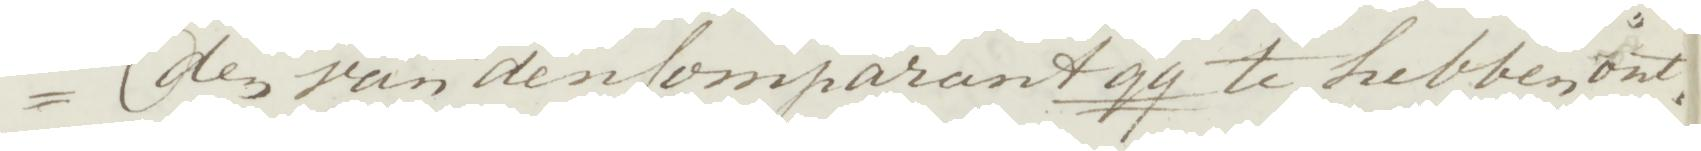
=den van den Comparant qq te hebben ont„
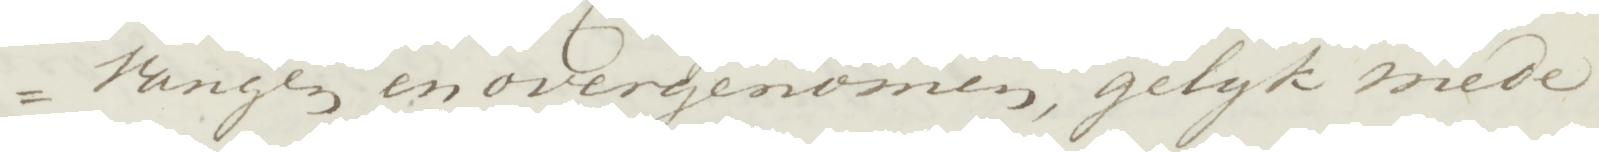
=vangen en overgenomen, gelyk mede
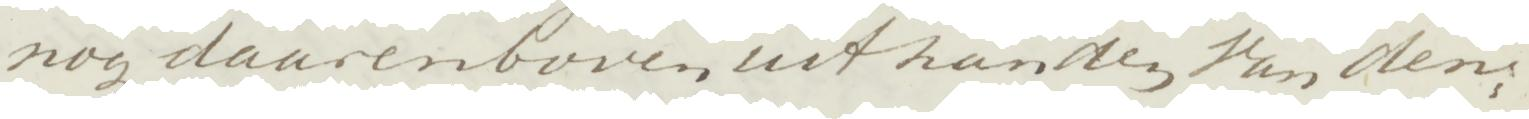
nog daarenboven uit handen van den„
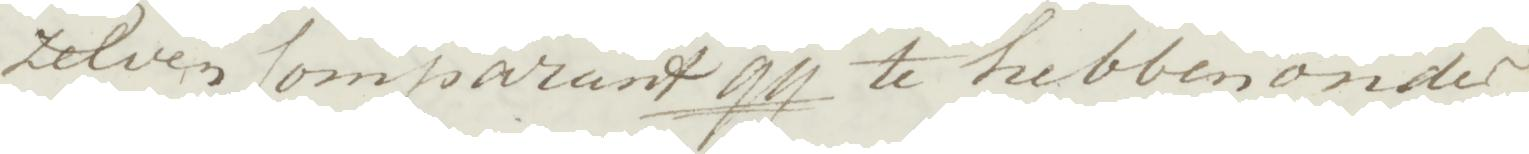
zelven Comparant qq te hebben onder
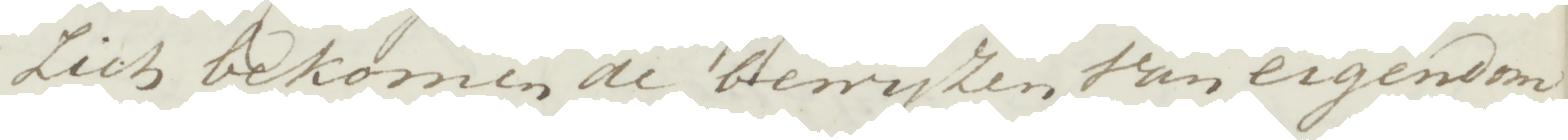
zich bekomen de bewyzen van eigendom
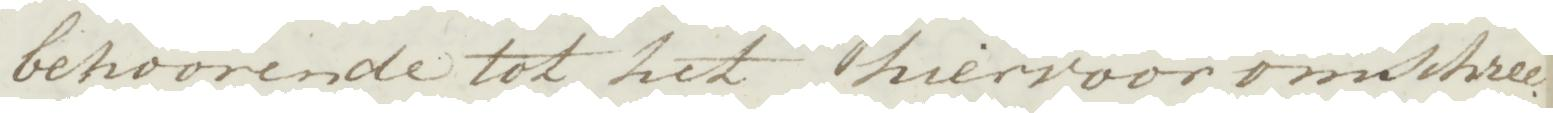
behoorende tot het hiervoor omschree:
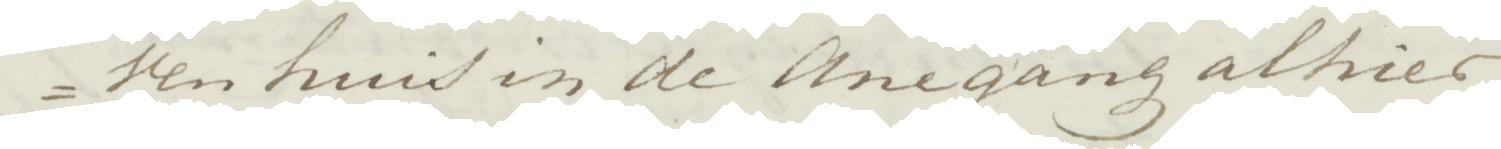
=ven huis in de Anegang alhier
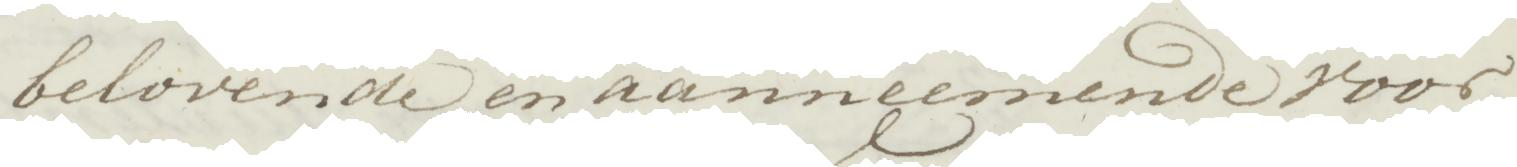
belovende en aanneemen de Voor
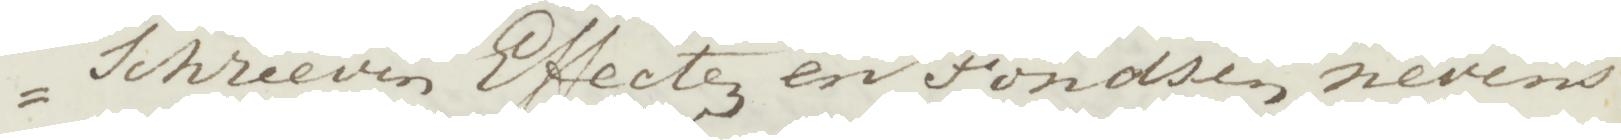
=schreeven Effecten en Fondsen nevens
